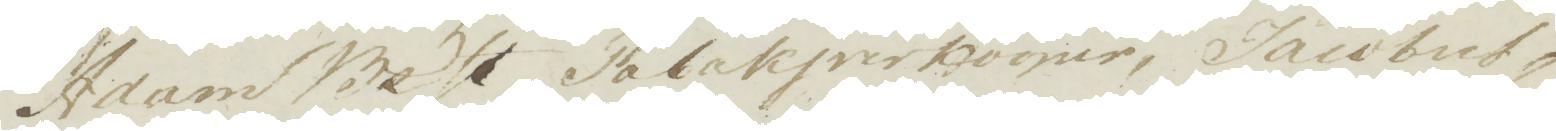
Adam Best Tabakverkooper, Iacobus
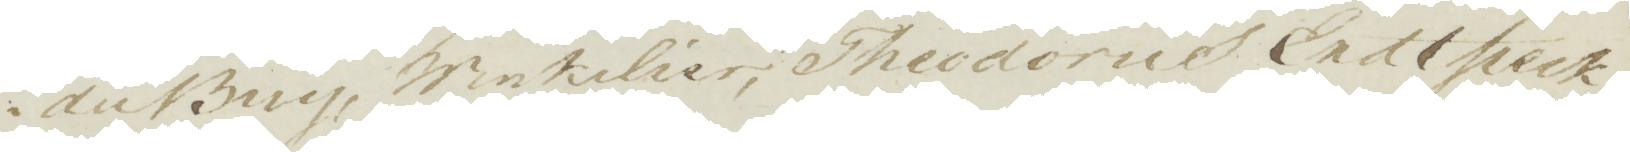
=du Buy, Winkelier; Theodorus Erdtsieck,
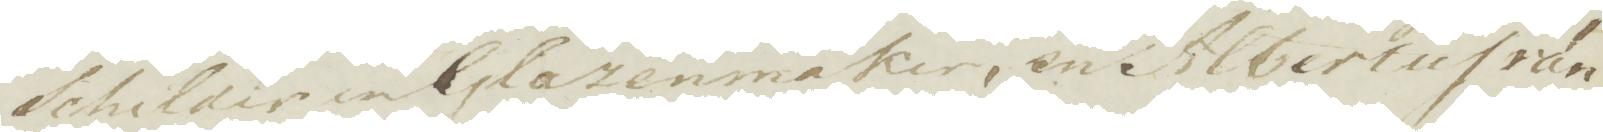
schilder en Glazenmaker, en Albertus van
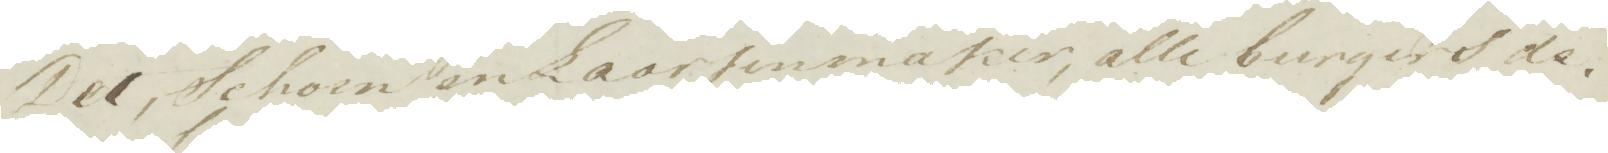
Det, schoen en Laarsenmaker, alle burgers de„
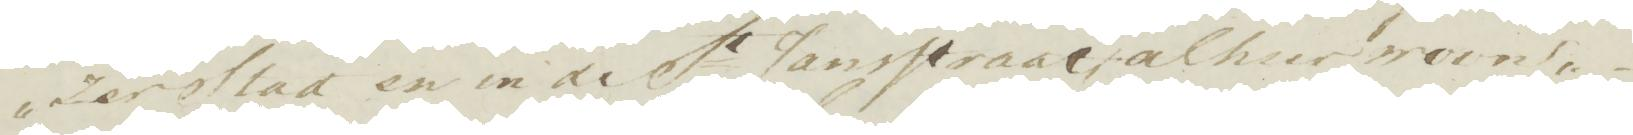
„zer stad en in de J: Jansstraat, alhier woon„
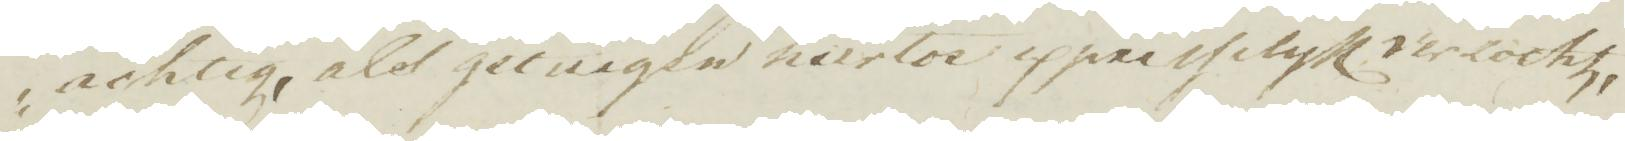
„achtig, als getuigen hiertoe expresselyk verzocht,
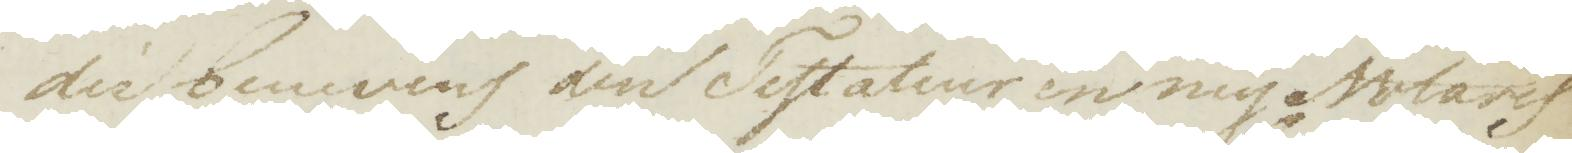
die benevens den Testateur en my Notaris
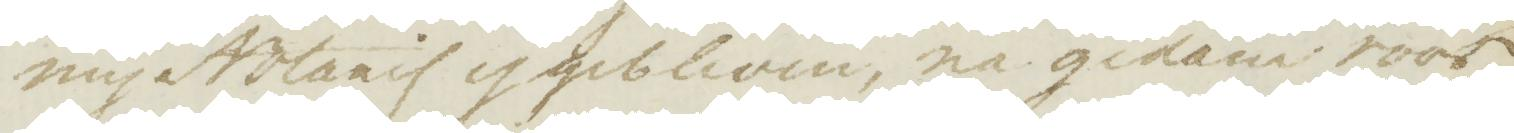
my Notaris is gebleven, na gedane voor
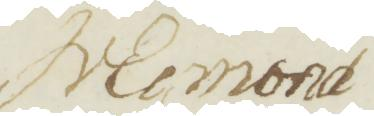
JvEgmond
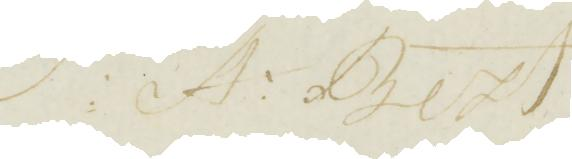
I: A: Best
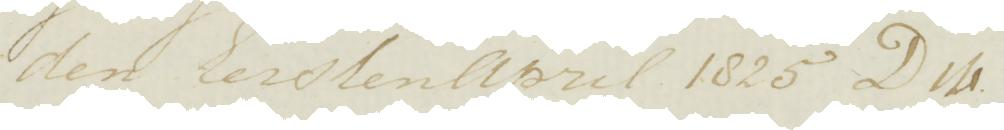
den Eersten April 1825 D 14.
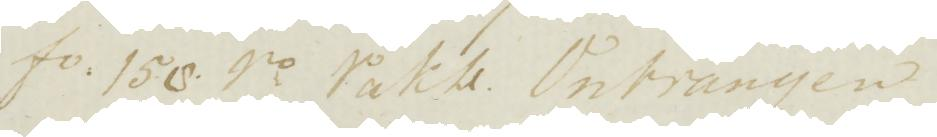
f.o 158: V„o Vak 4. Ontvangen
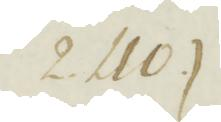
f 2.40.
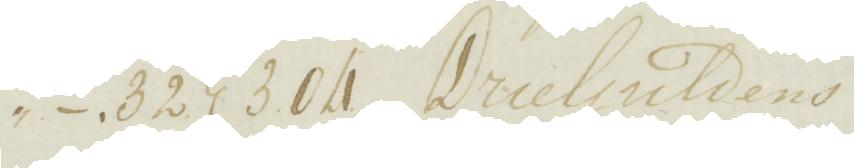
„ —. 32 3.04 Drie Guldens
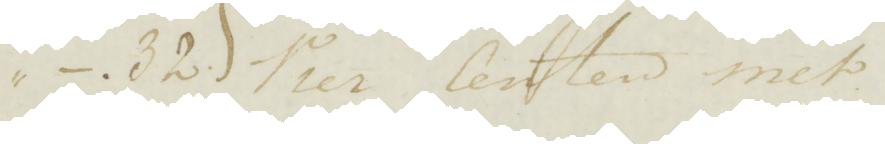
„ —. 32 Vier Centen met
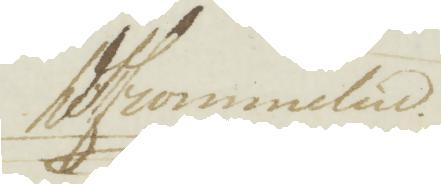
D: F:Crommelin
